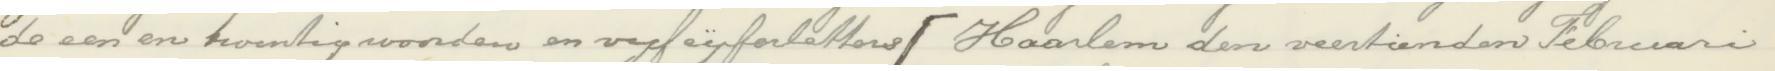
de een en twintig woorden en vyf cijferletters ¶ Haarlem den veertienden Februari
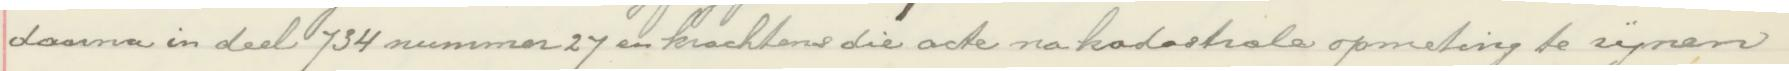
daarna in deel 734 nummer 27 en krachtens die acte na kadestrale opmeting te zijnen
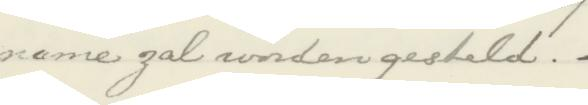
name zal worden gesteld.
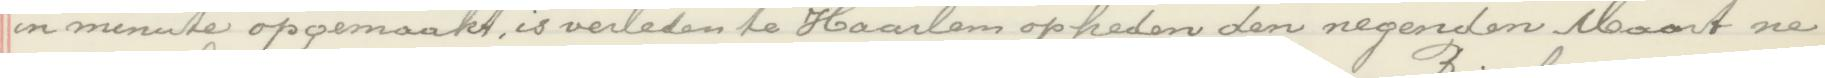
in minute opgemaakt, is verleden te Haarlem op heden den negenden Maart ne
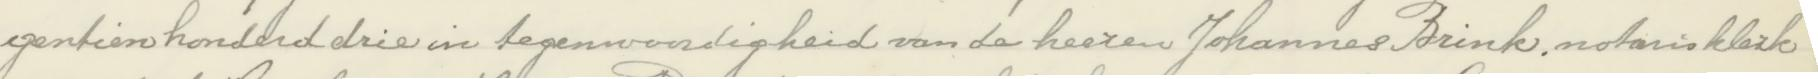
gentien honderd drie in tegenwoordigheid van de heeren Johannes Brink, notarisklerk
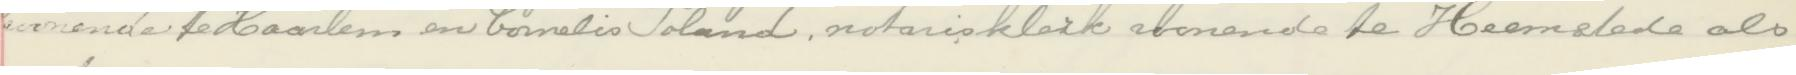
wonende te Haarlem en Cornelis Poland, notarisklerk wonende te Heemstede als
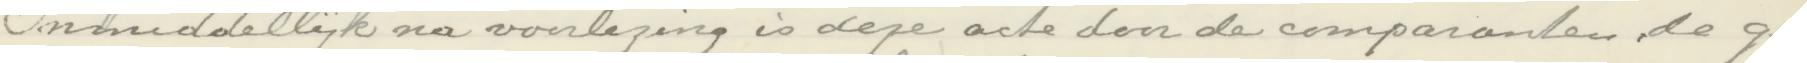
Onmiddellijk na voorlezing is deze acte door de comparanten, de ge
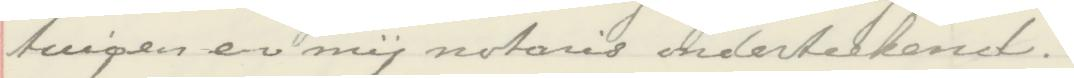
tuigen en mij notaris onderteekend.
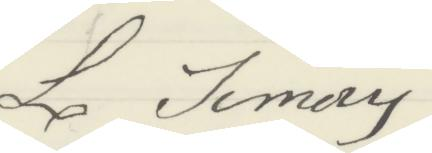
L Simons
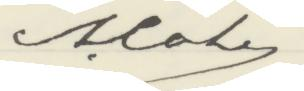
A.Cohen
